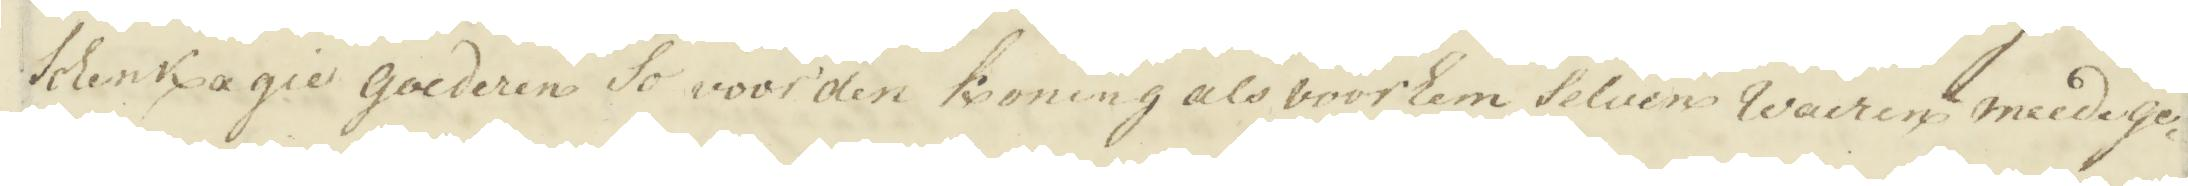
schenkagie goederen so voor den koning als voor hem selven waren meedige„
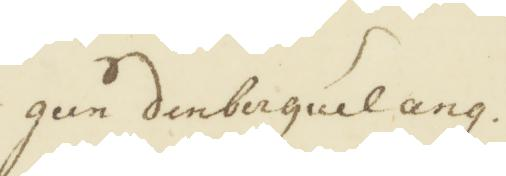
geen denberquelang.
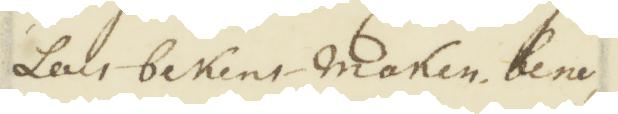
zou bekent maken bene„
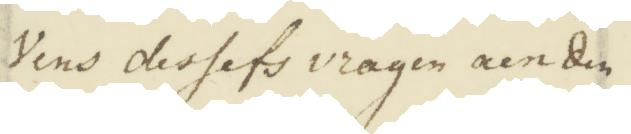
vens dessefs vragen aen den
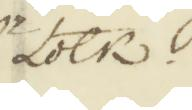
tolk
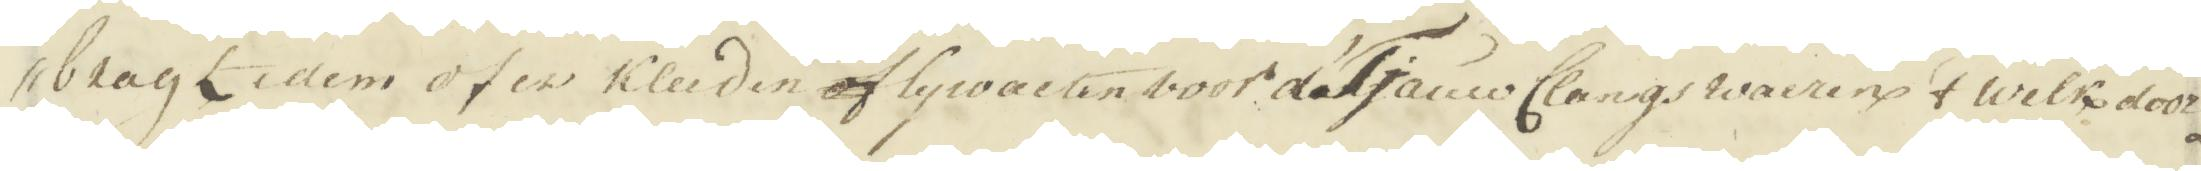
bragt idem of er kleeden of lywaeten voor d'Tjauw Clangs waeren ’t welk door
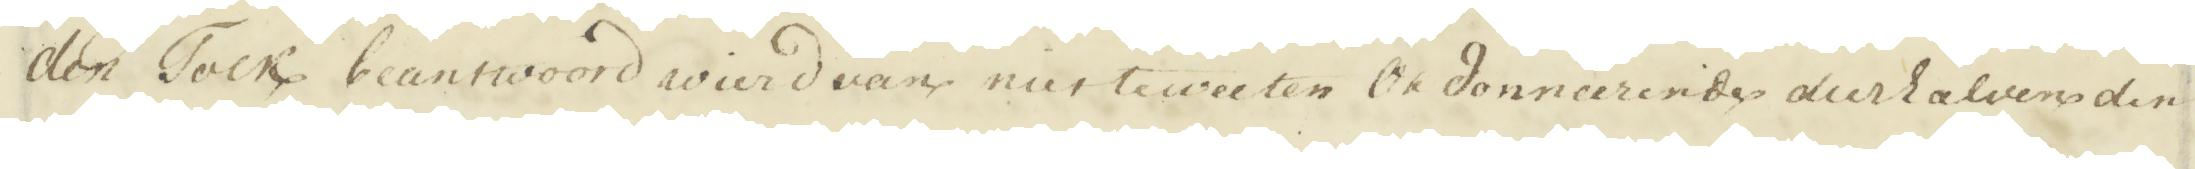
den Tolk beantwoord wierd van niet teweeten ordonneerende dierhalven den
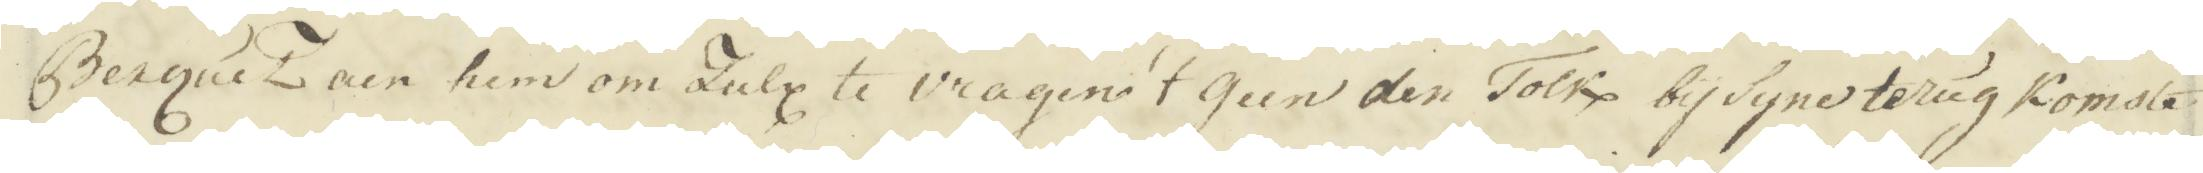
BerqueLaen hem om zulx te vragens ’t geen den Tolk bij sijne terug komste
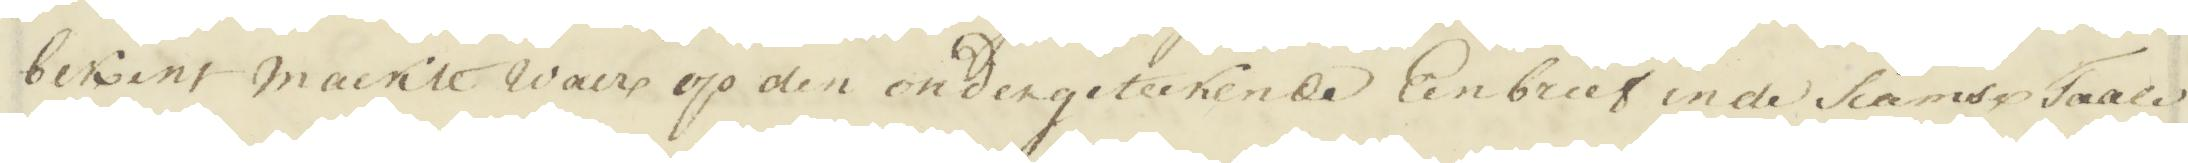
bekent maekte waer op den ondergeteekende Een brief in de siamse Taale
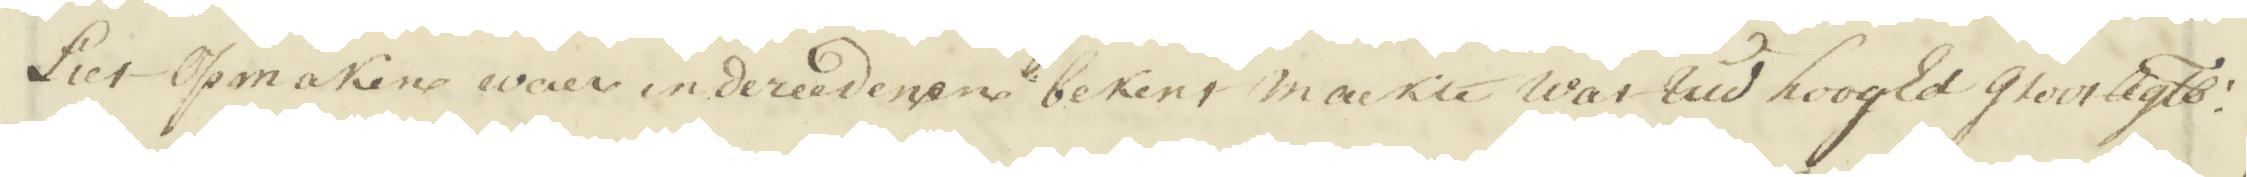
Liet opmaken waer in de reedenen bekent maekte wat uw hooghd groot agtb:
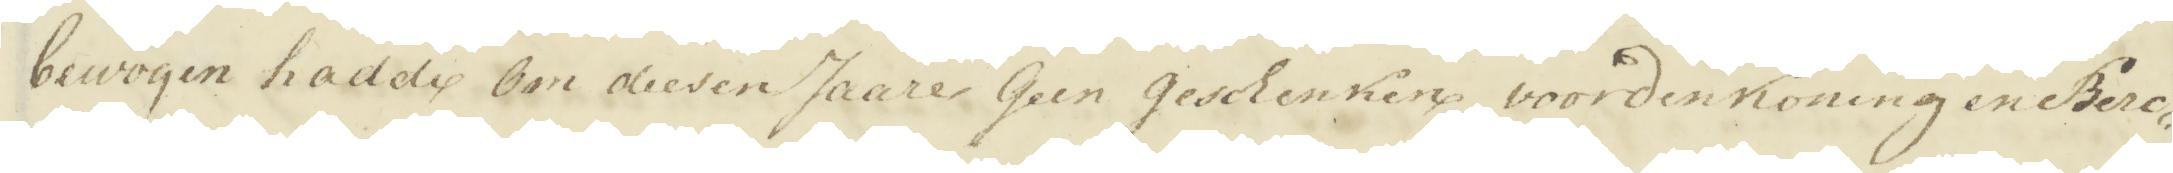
bewogen hadde van deesen Jaare Geen geschenken voor den koning in Berc„
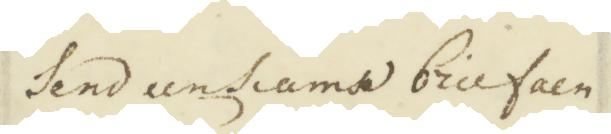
send een siamse brief aen
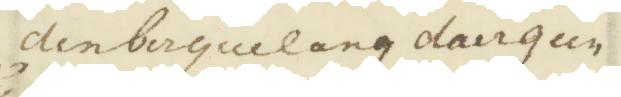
den berquelang daer geen
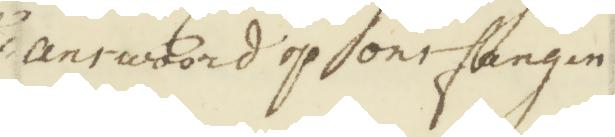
antwoord op ontfangen
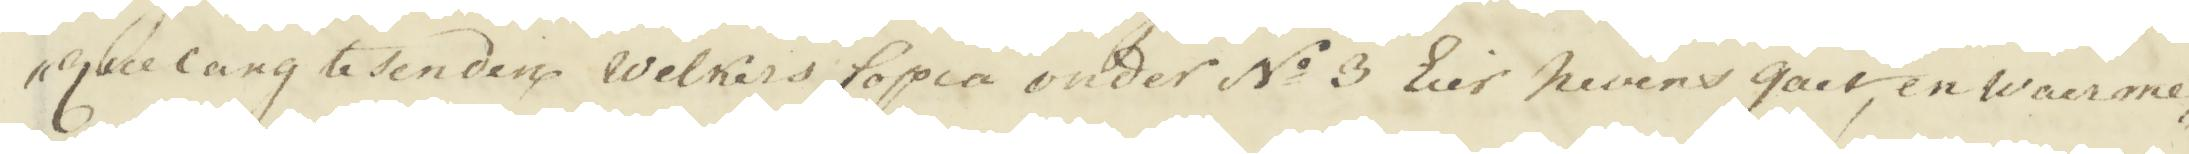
„quelang te senden welkers Copia onder N=o 3 hier nevens gaet, en waerme„
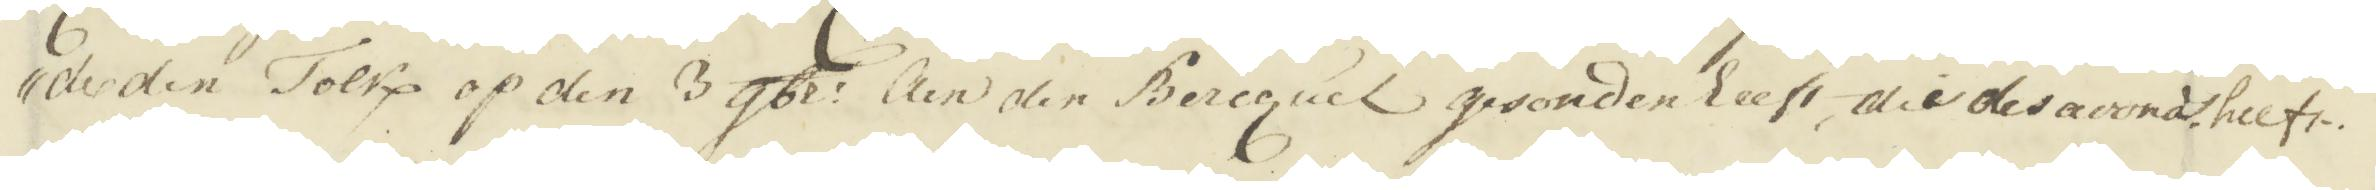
„de den Tolk op den 3 9br: aen den Bercquel gesonden heeft, die des avond heeft.
